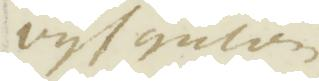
Vyf gulden
